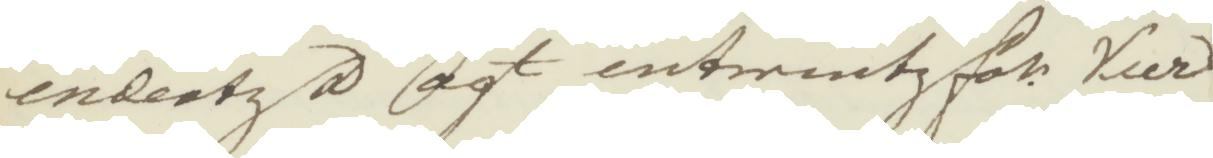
en dertig @ agt en twintig fol. Vier
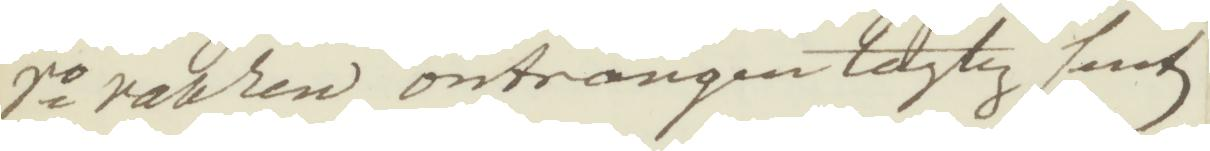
V=o vak Een ontvangen tagtig Cent
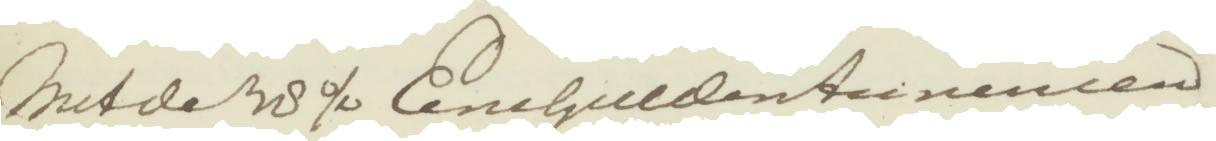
met de 38% Eene Gulden tien en een
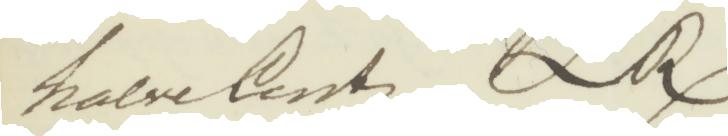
halve Cent. ZR
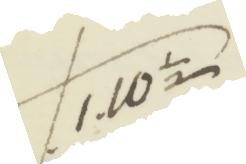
f 1.10½
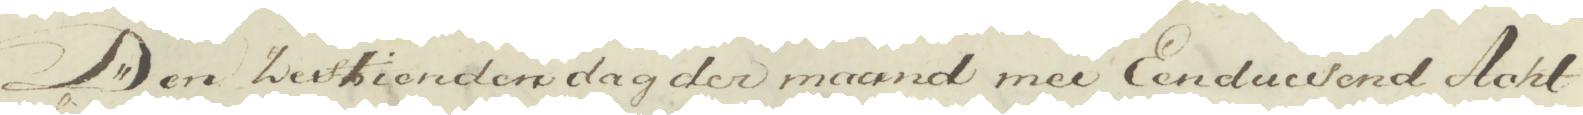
Den Zestienden dag der maand mei Een duisend Acht
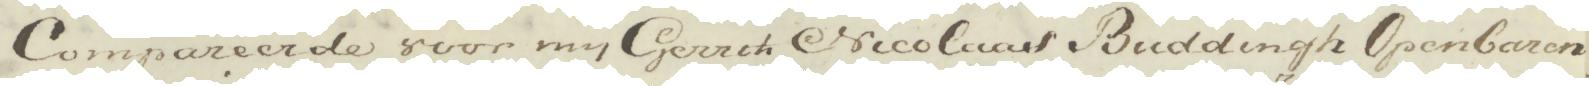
Compareerde voor my Gerrit Nicolaas Buddingh Openbaren
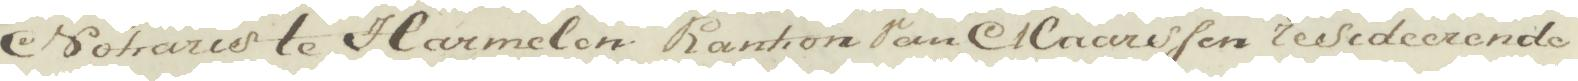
Notaris te Harmelen Kanton van Maarssen resideerende
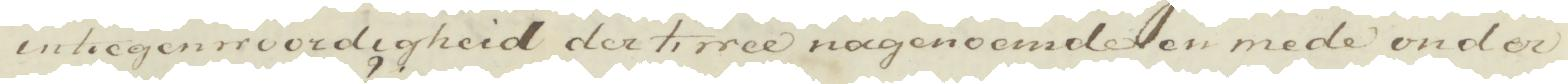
in tegenwoordigheid der twee nagenoemde en mede onder
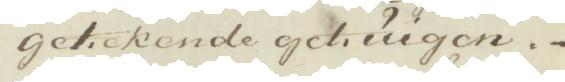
getekende getuigen.
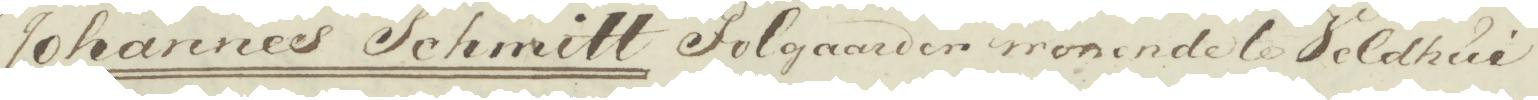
Johannes Schmitt, Tolgaarder wonende te Veldhui
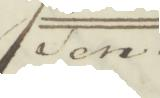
sen
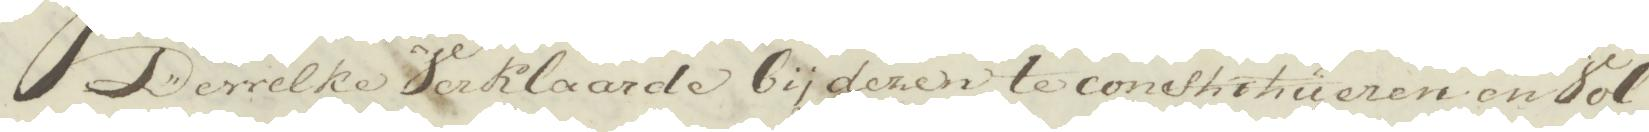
Dewelke Verklaarde bij dezen te constitueren en Vol
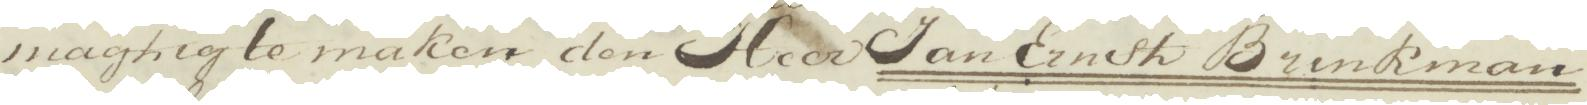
magtig te maken den Heer Ian Ernst Brinkman
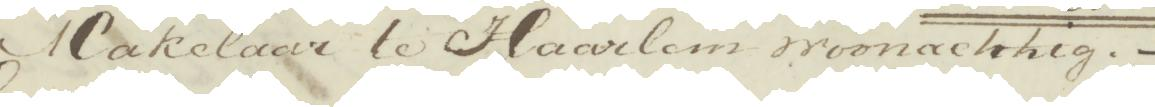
Makelaar te Haarlem woonachtig.
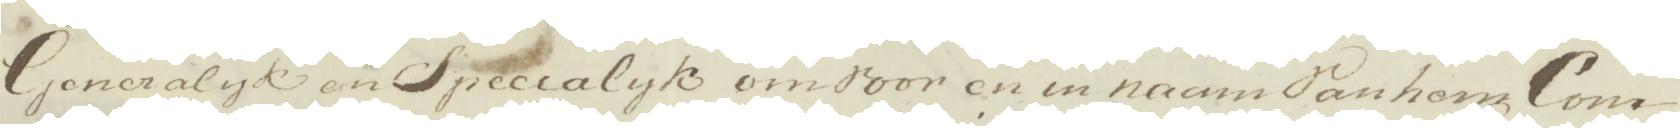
Generalyk en Specialyk om voor en in naam Van hem Com
